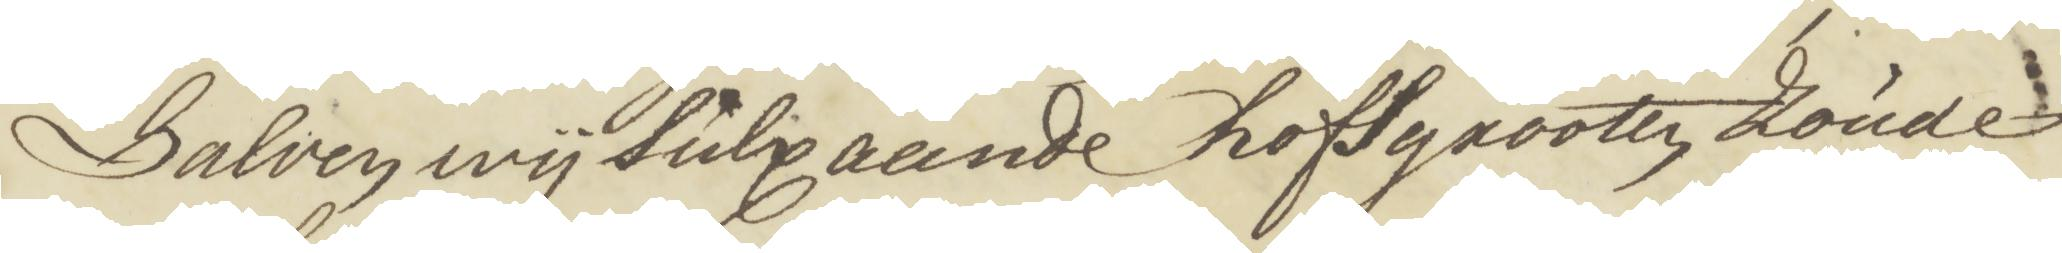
halven wij sulx aande hofsgrooten zoude
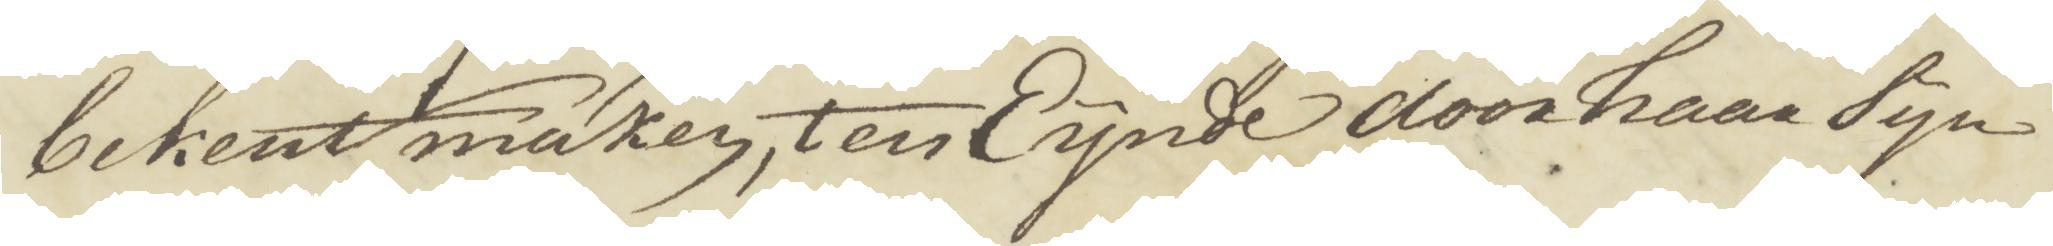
bekent maken, ten Eijnde door haar sijn
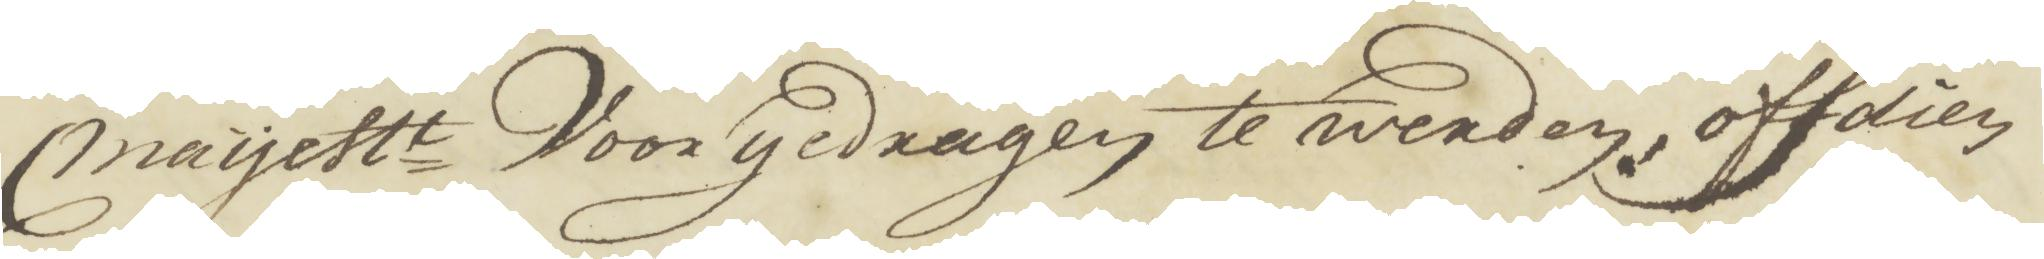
maijest=t Voor gedragen te werden, off dien
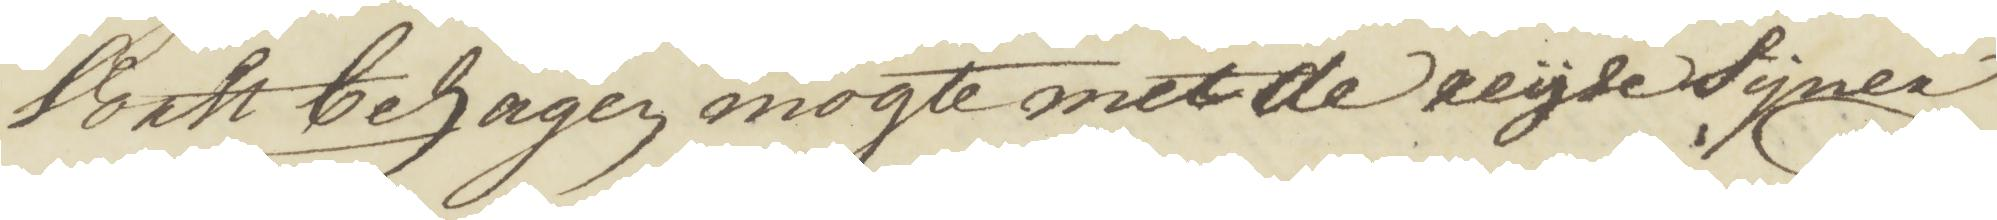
Vorst behagen mogte met de reijse sijner
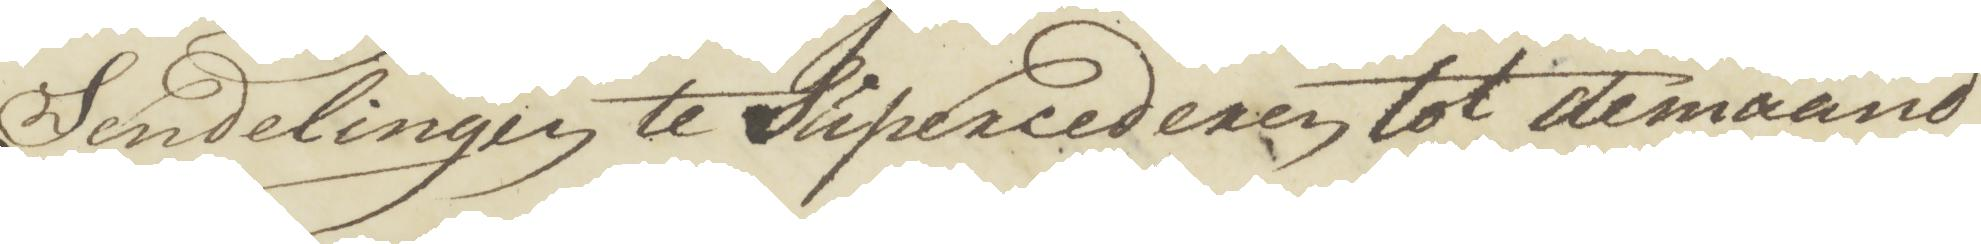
Sendelingen te Supercederen tot de maand
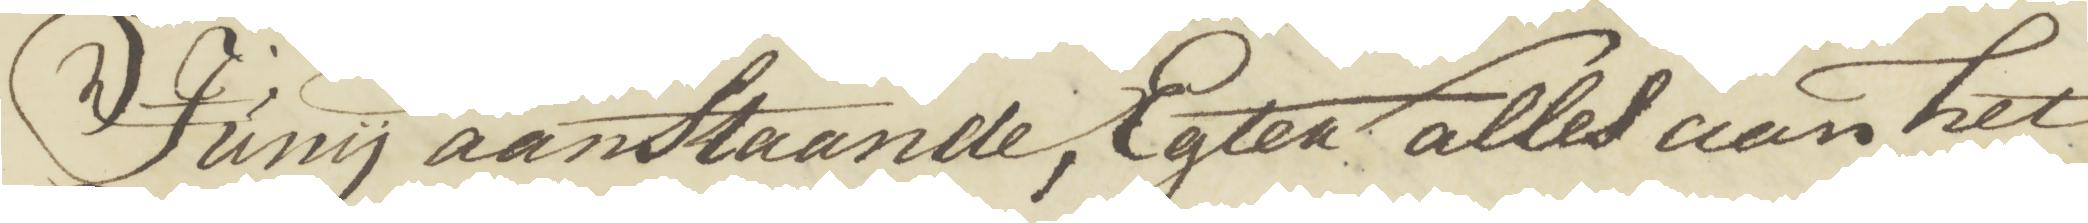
Junij aanstaande, Egter: alles aan het
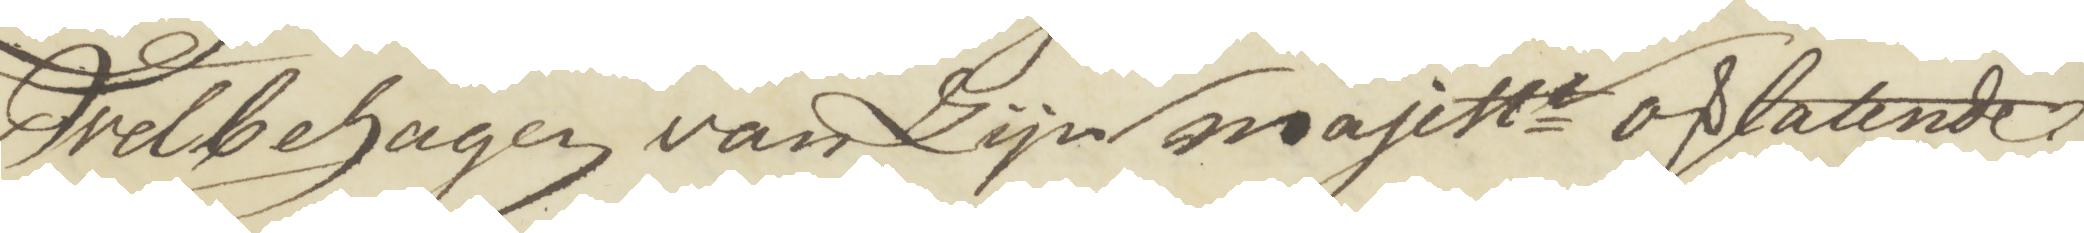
welbehagen van Zijn majest=t overlatende
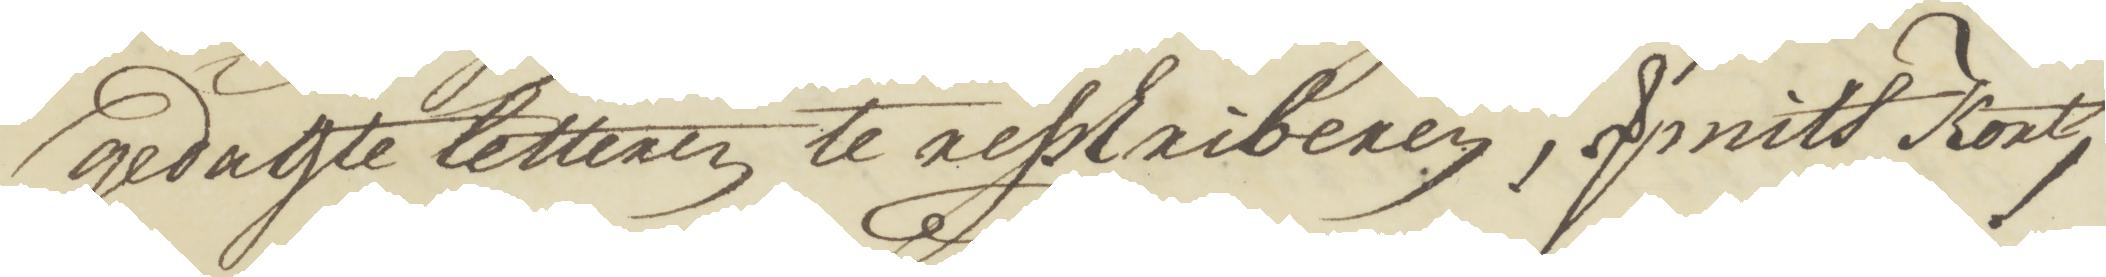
gedagte letteren te reschriberen, vermits kort,
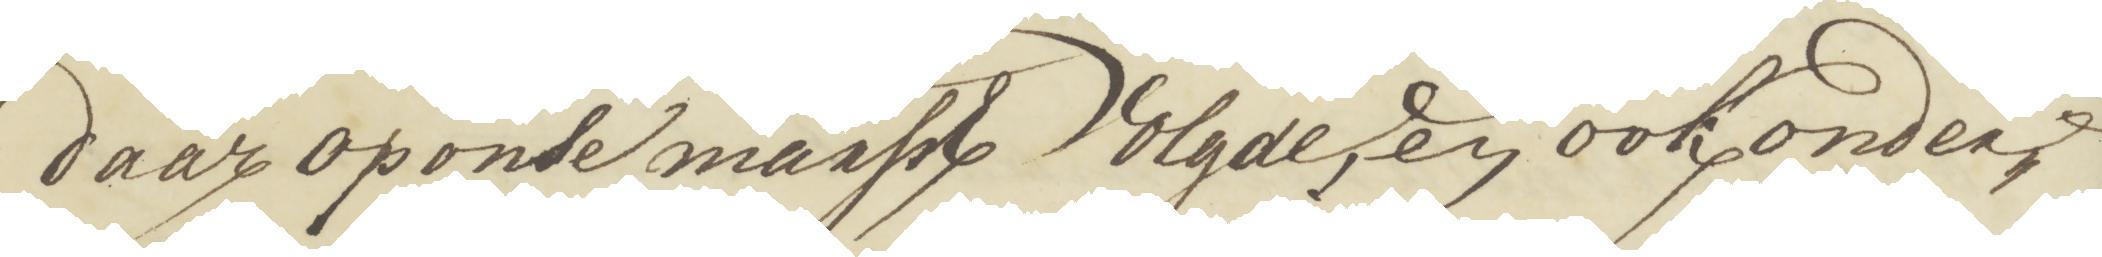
daar op onse marsch Volgde, en ook onder„
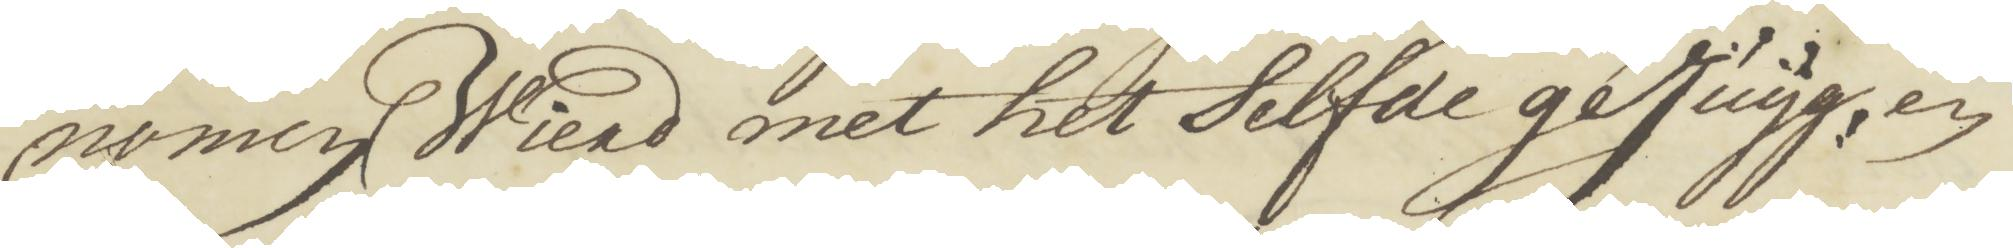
nomen Wierd met het selfde geJuijg, en
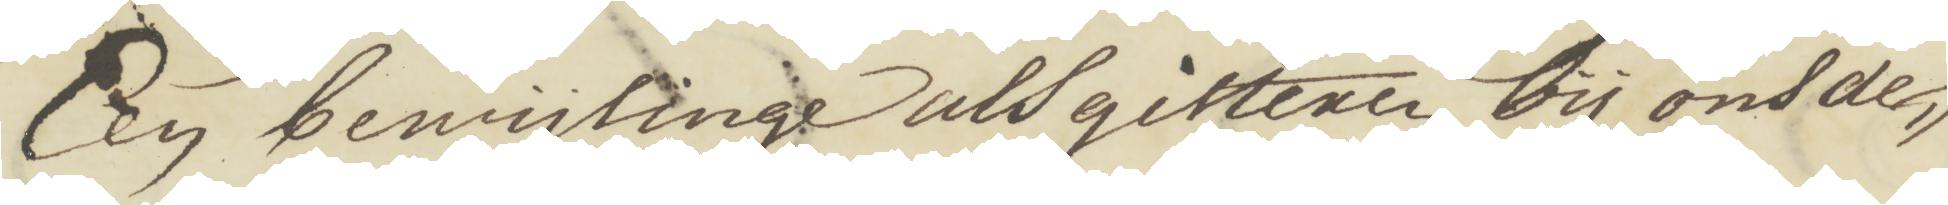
Een bewijsinge als gisteren bij ons de„
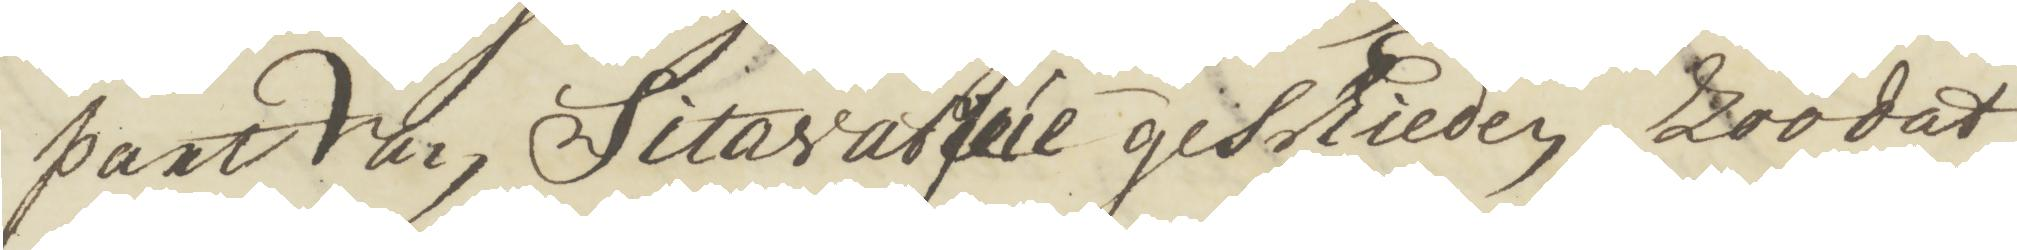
part van Sitavasfue geschieden, zoo dat
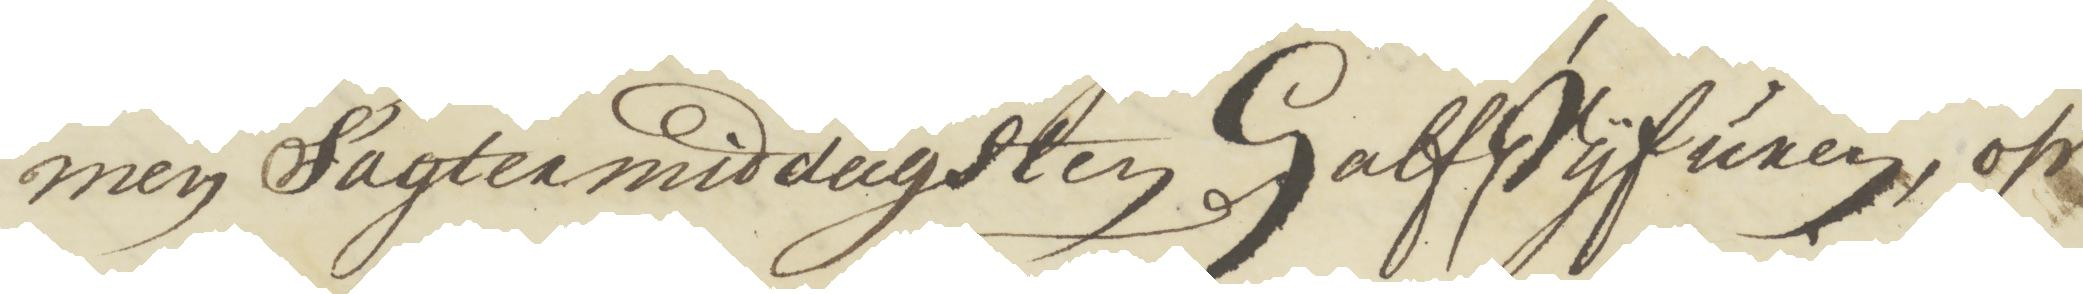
men s'agtermiddags ten Half Vijf uren, op
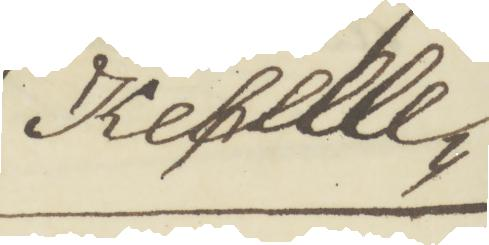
kepelle„
